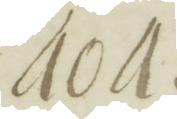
404
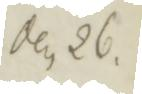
den 26.
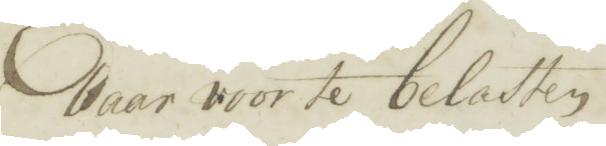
Daar voor te belasten
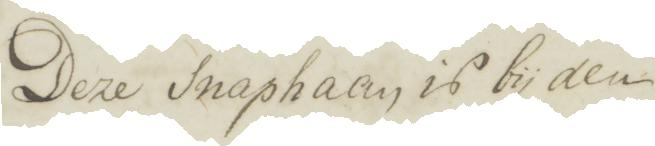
Deze snaphaan is bij den
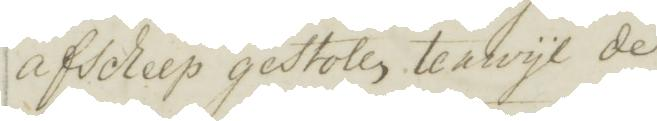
afscheep gestolen terwijl de
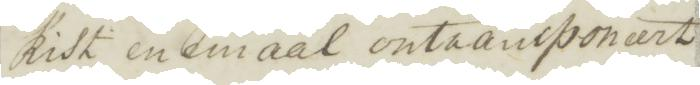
kist enemaal ontransponeert
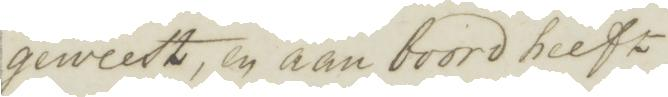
geweest, en aan boord heeft
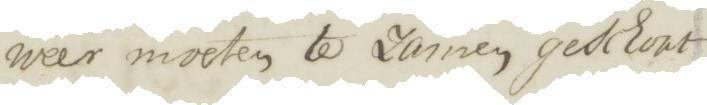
weer moeten te zamen geschort
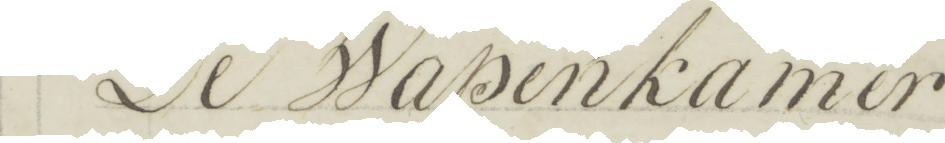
De Wapenkamer
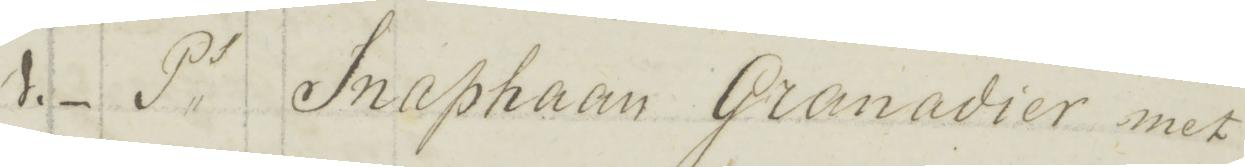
1._ P„s Snaphaan Granadier met
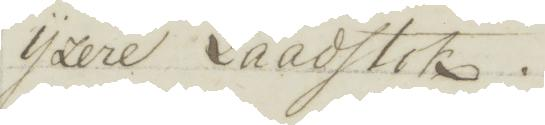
ijzere laadstok.
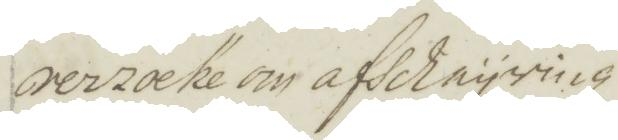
verzoeke om afschrijving
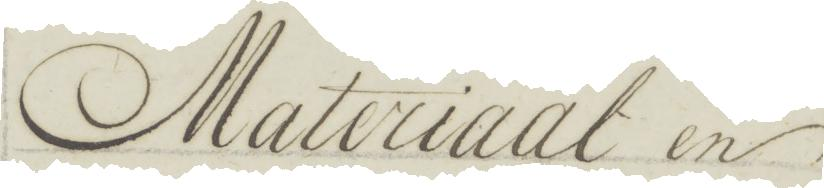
Materiaal en
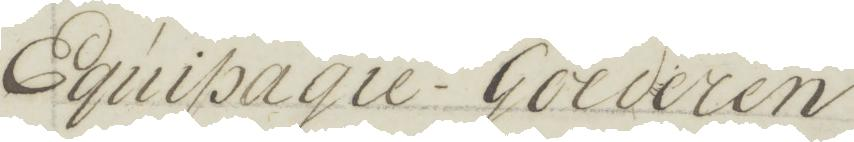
Equipagie-Goederen
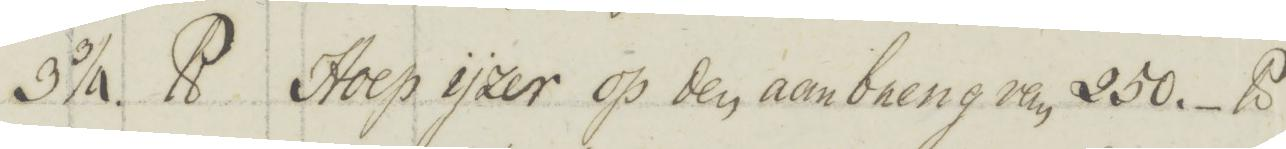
3¾. lb Hoep ijzer op den aanbreng van 250._ lb
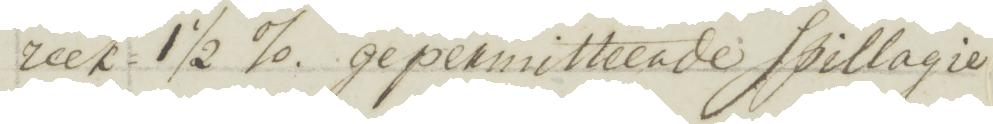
reek:t 1½ %. gepermitteerde spillagie
